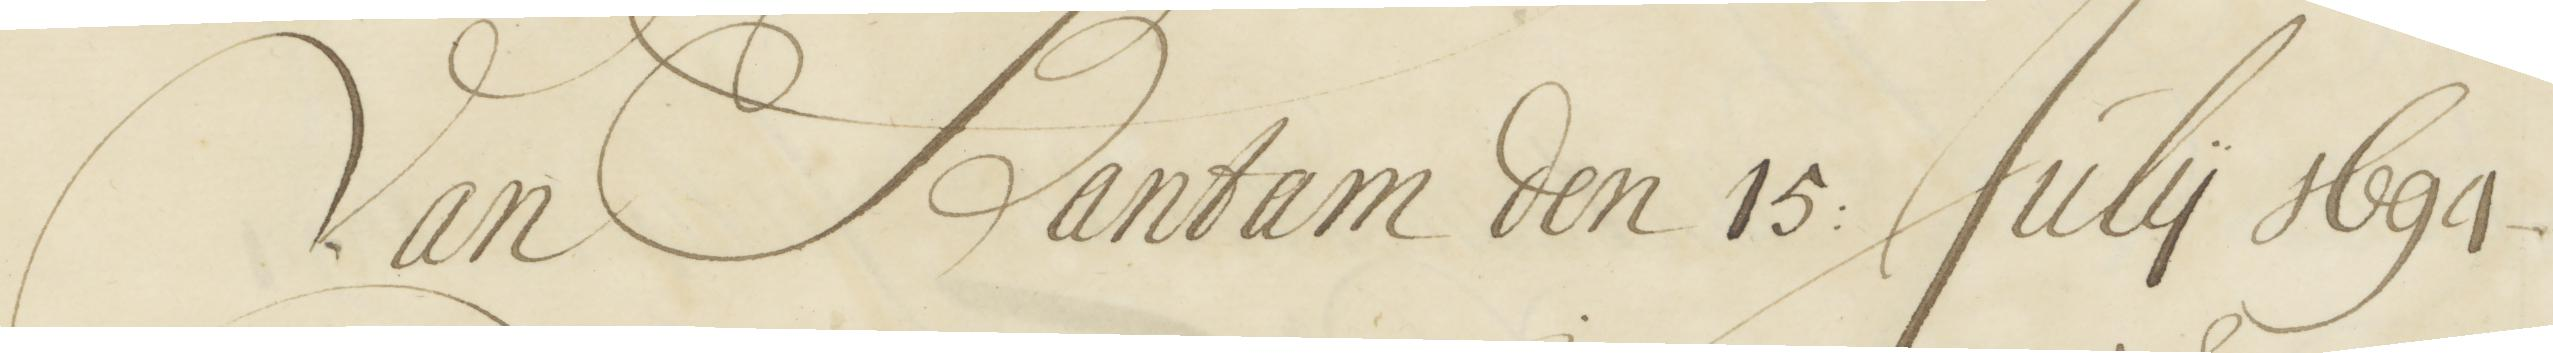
Van Bantam den 15: Julij 1694 —
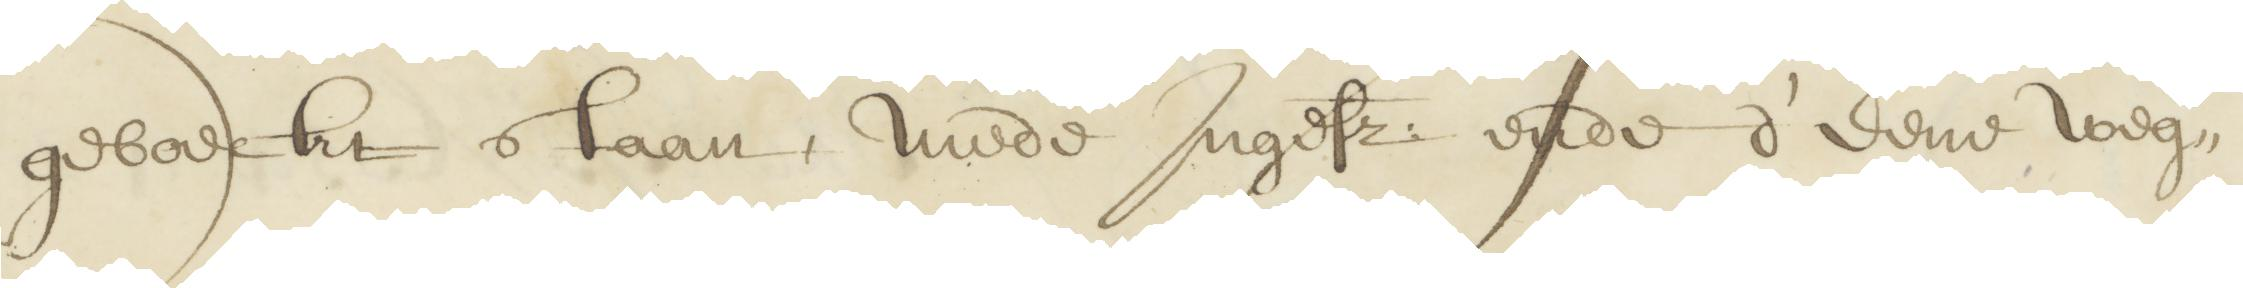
geboeckt staan, Mede Jngesz: ende d’ Eene Weg„
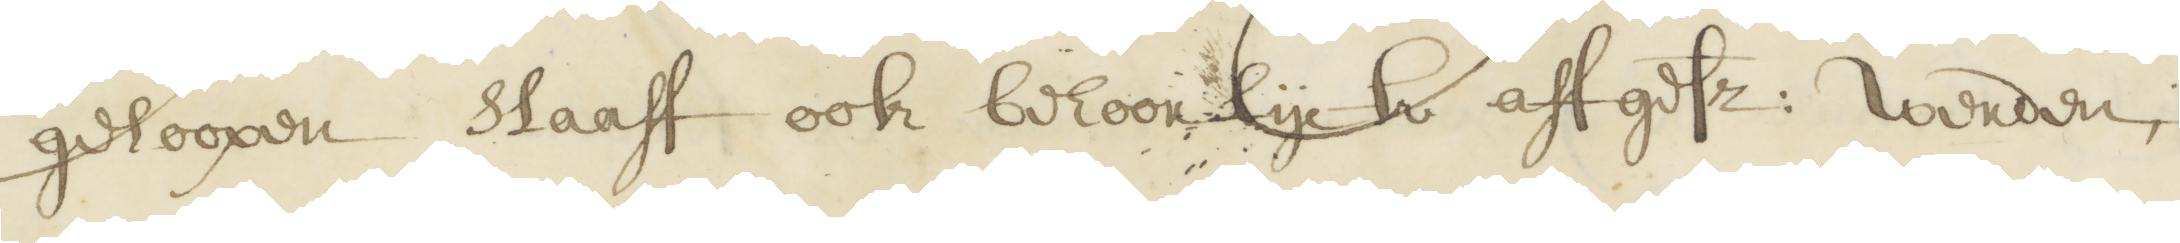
geloopen slaaff ook behoorlijck affgesz: Werden;
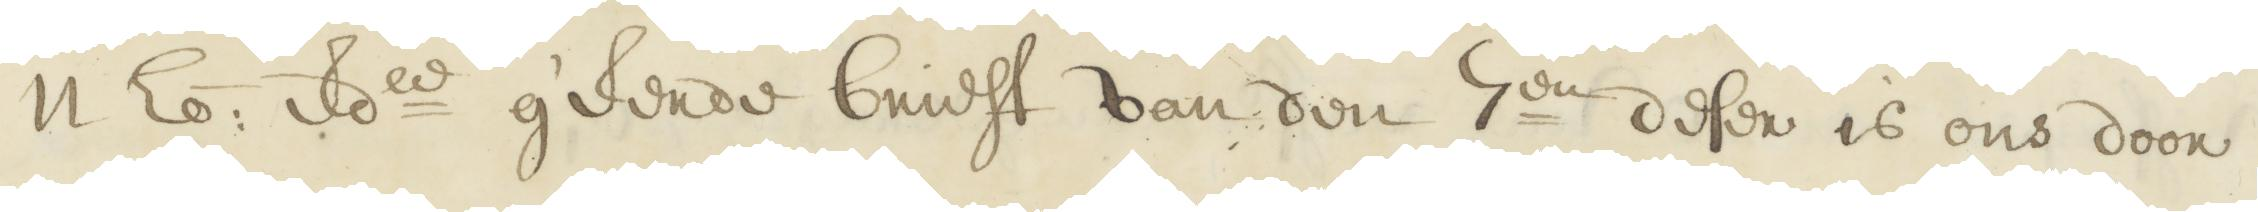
U ho: Ed=le g’Eerde brieff Van den 7=en deser is ons door
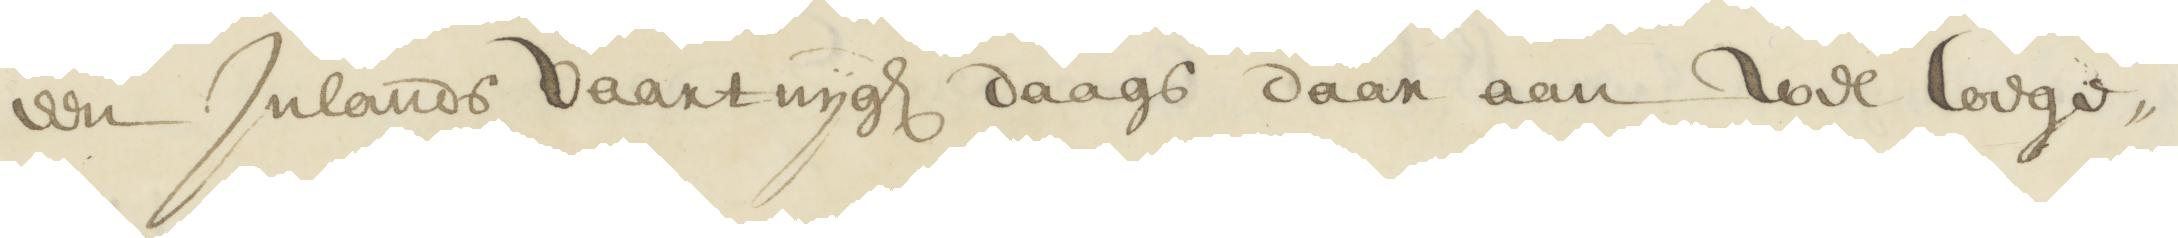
een Jnlands Vaartuijgh daags daar aan Wel toege„
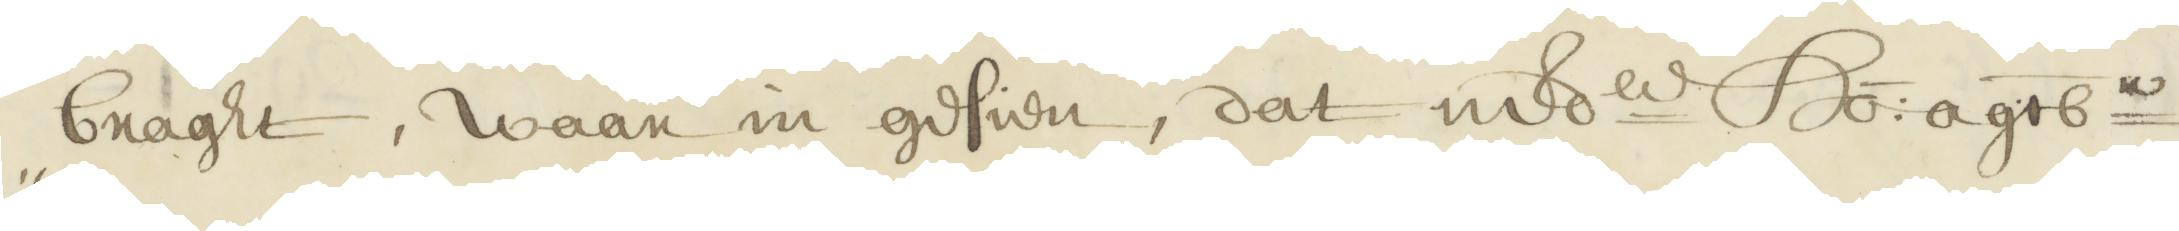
„braght, Waar in gesien, dat uEd=le Ho: agtb=re
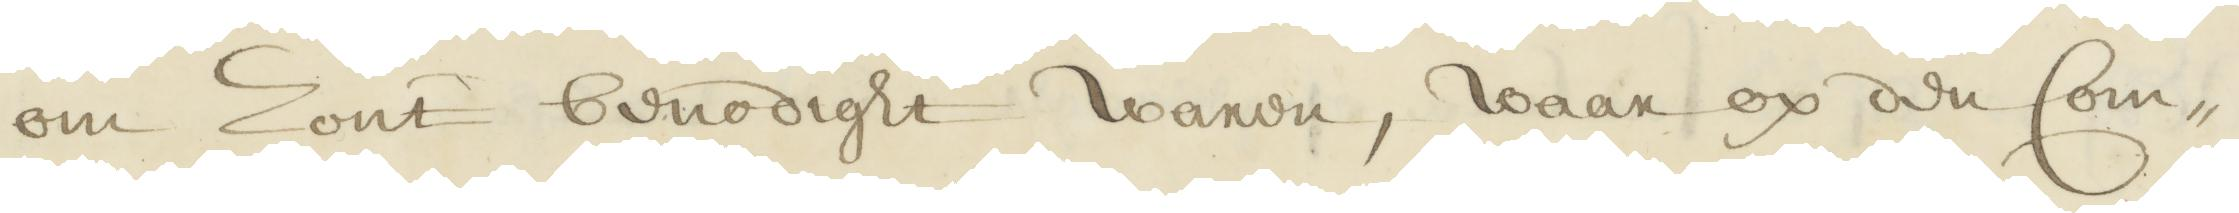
om zout benodight Waren, Waar op den Com„
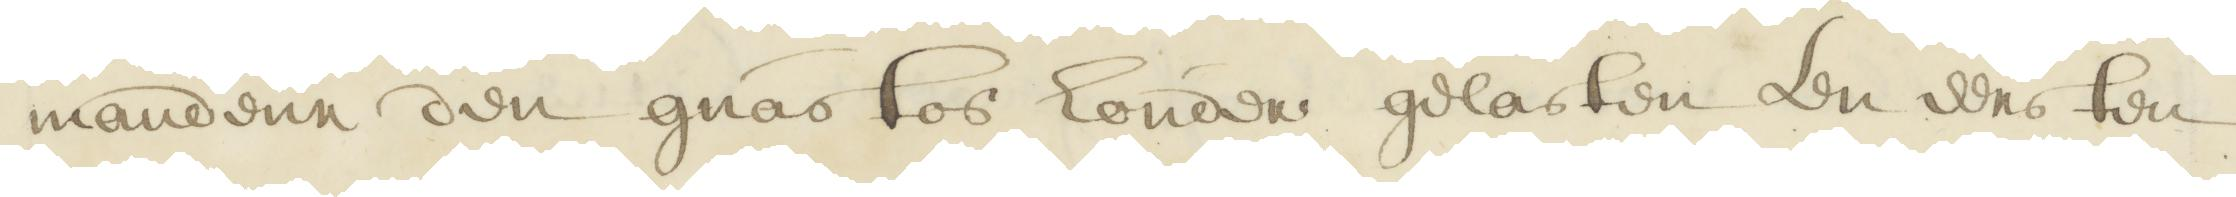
mandeur den guastos houder gelasten ten eersten
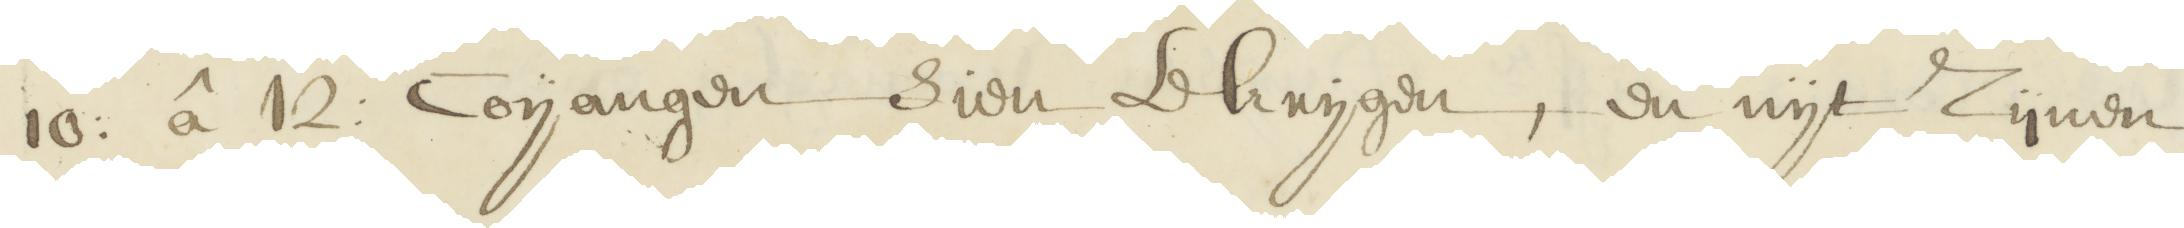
10: â 12: Coijangen sien tekrijgen, en uijt zijnen
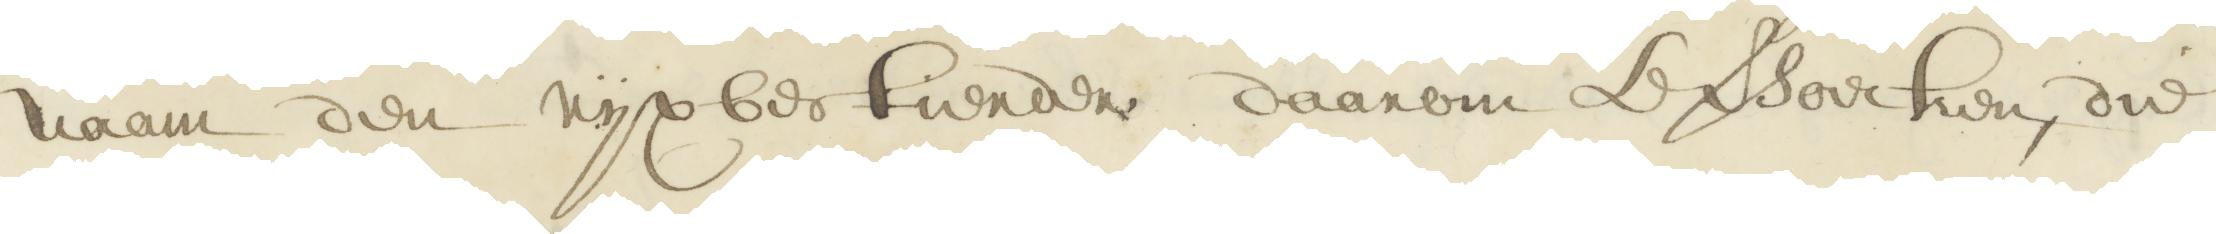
Naam den rijxbestierder daarom teversoecken, die
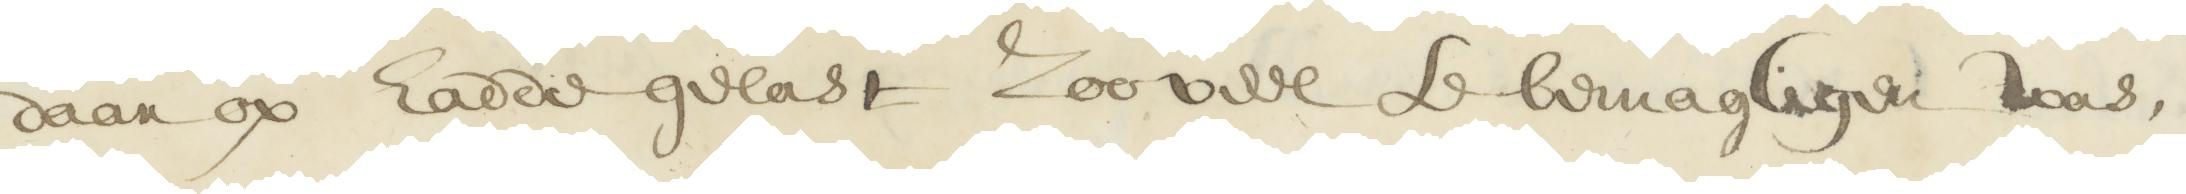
daar op hadde gelast zoo veel te bemagtigen Was,
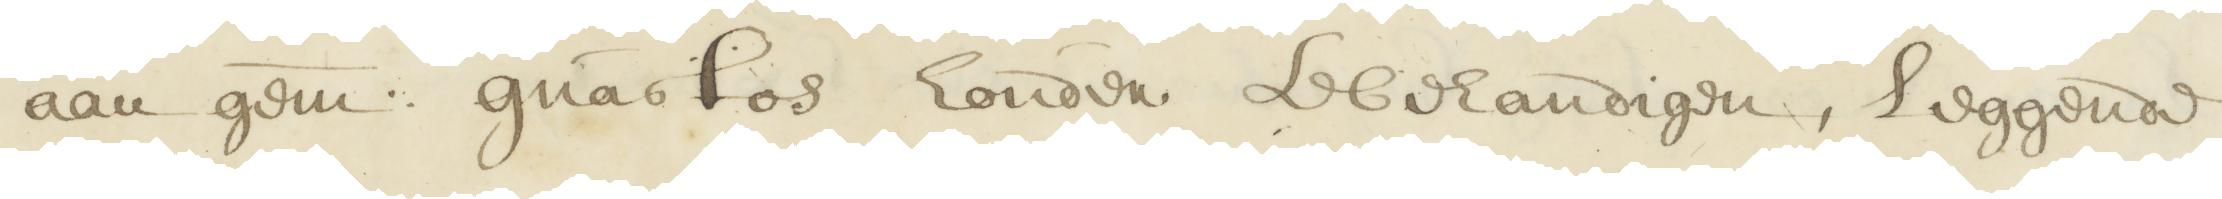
aan gem: guastos houder tebehandigen, leggende
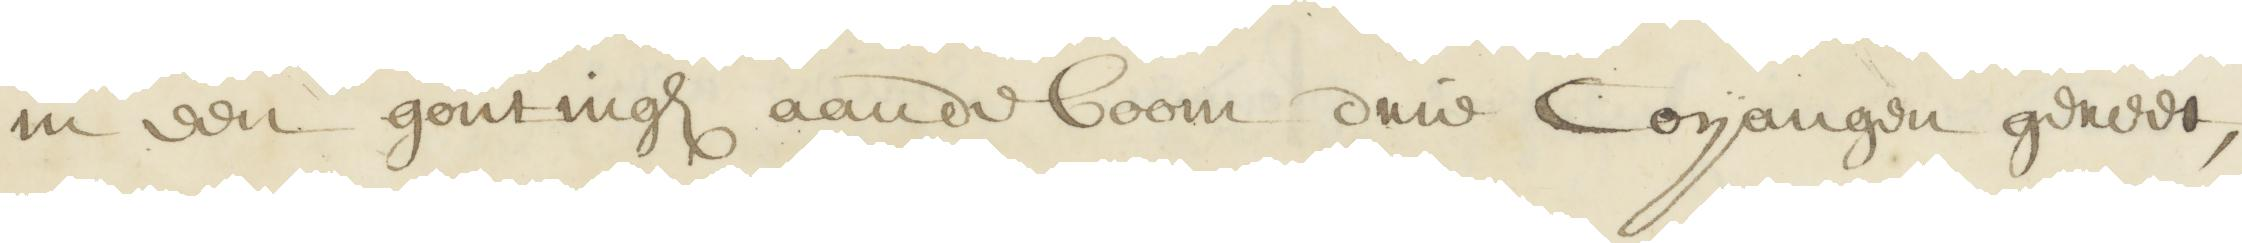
in een gontingh aande boom drie Coijangen gereet,
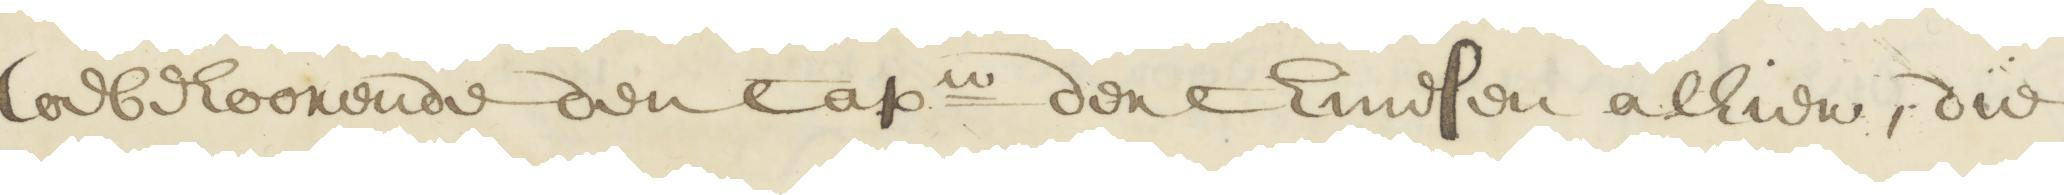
toebehoorende den Cap=n der chinesen alhier, die
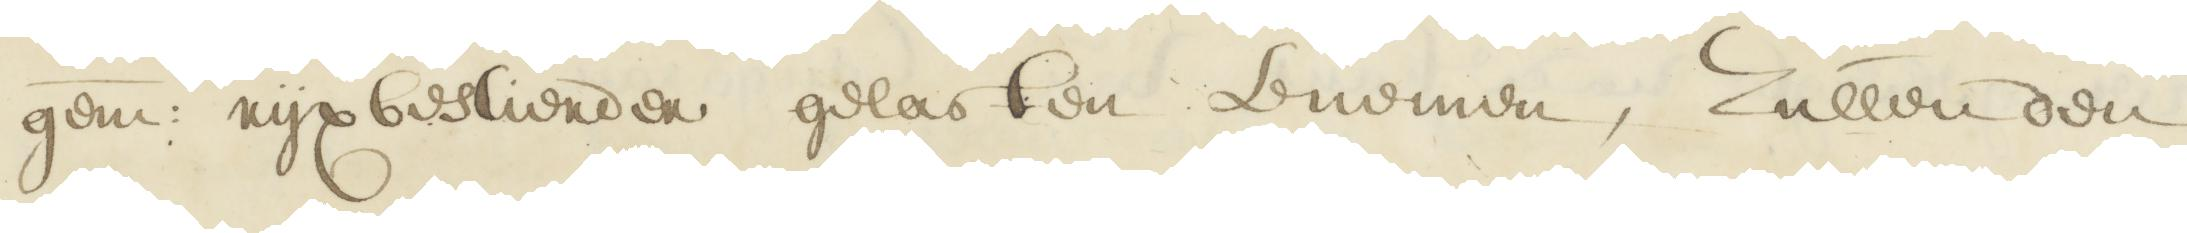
gem: rijxbestierder gelasten tenemen, zullen den
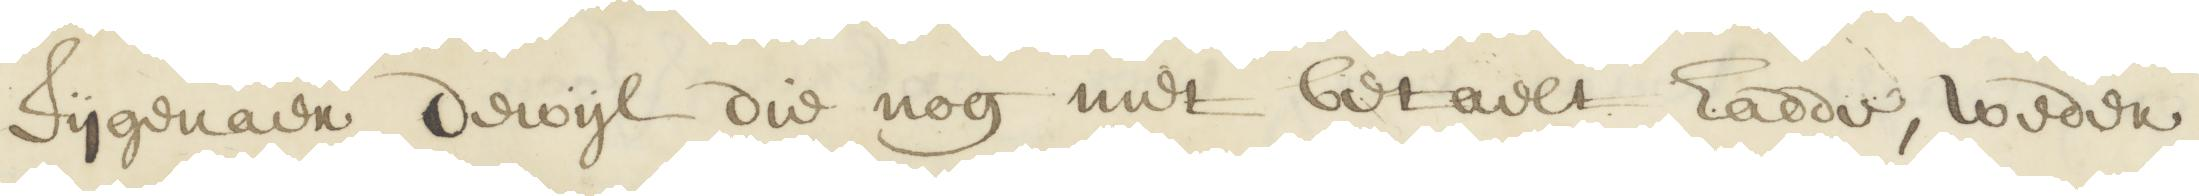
Eijgenaer dewijl die nog niet betaelt hadde, Weder
